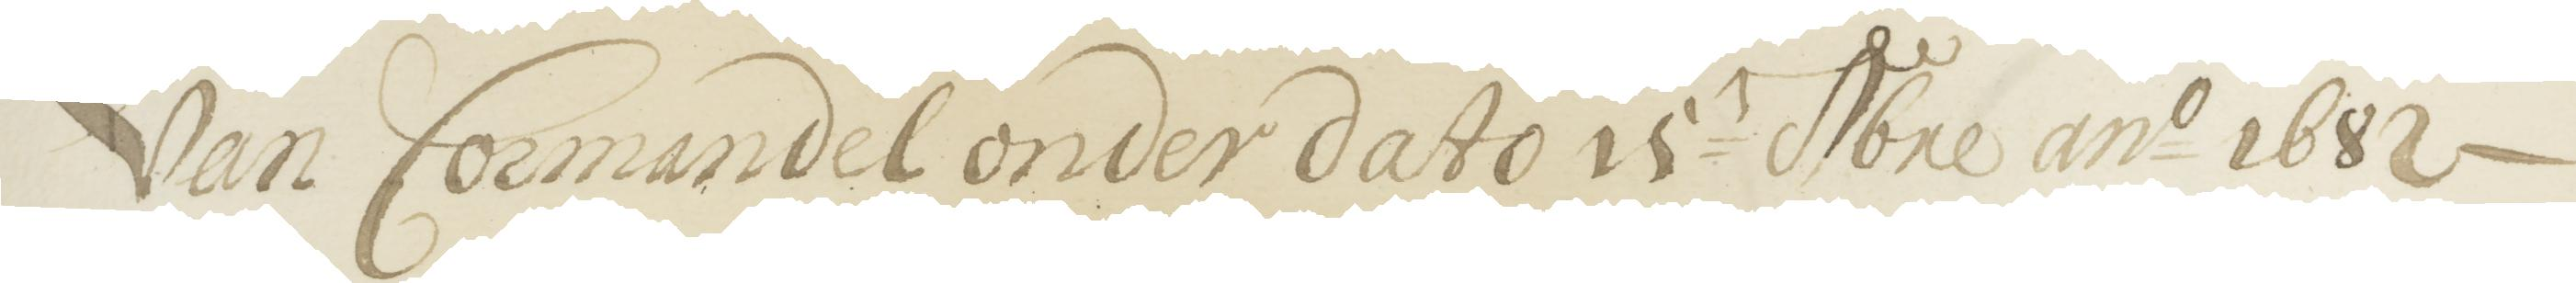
Van Cormandel onder dato 15:' 8bre an=o 1682
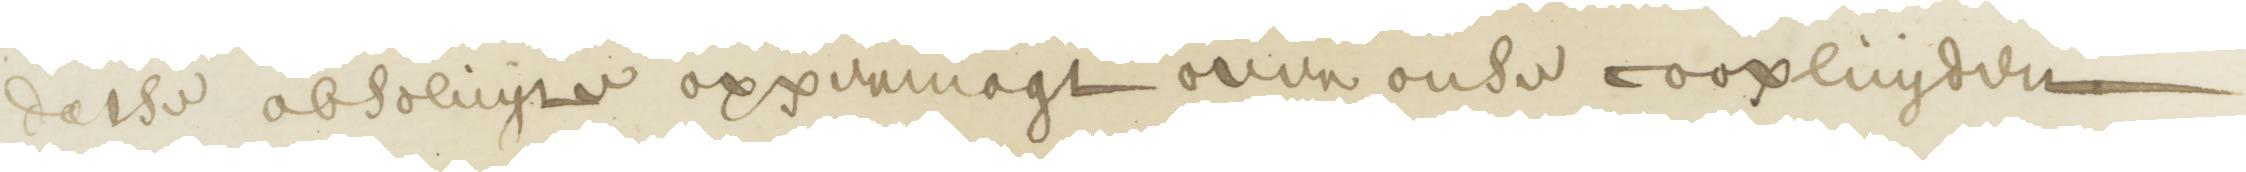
datse absoluijte oppermagt over onse coopluijden
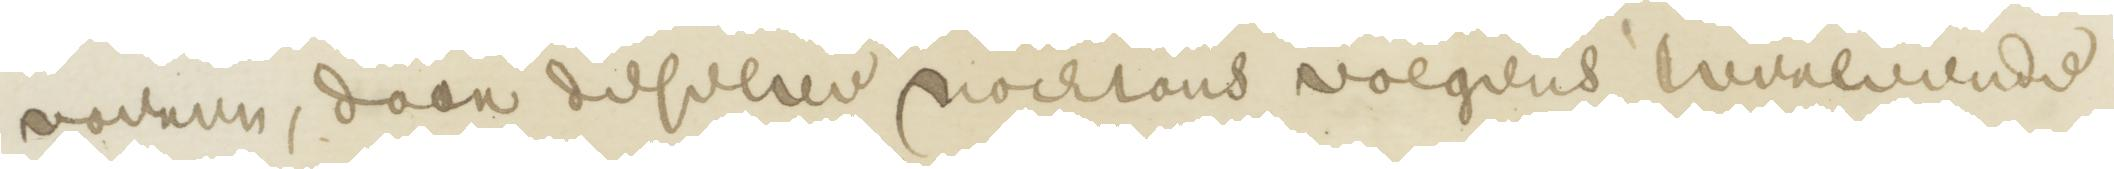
voeren, door deselve nochtans volgens 't verleende
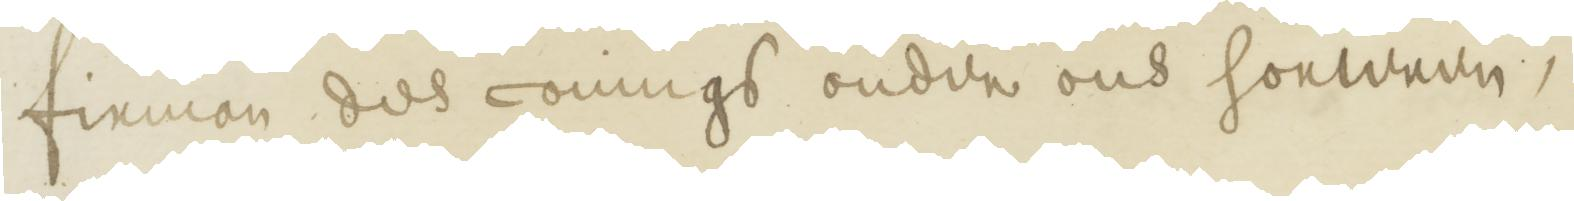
firman des conings onder ons sorteren,
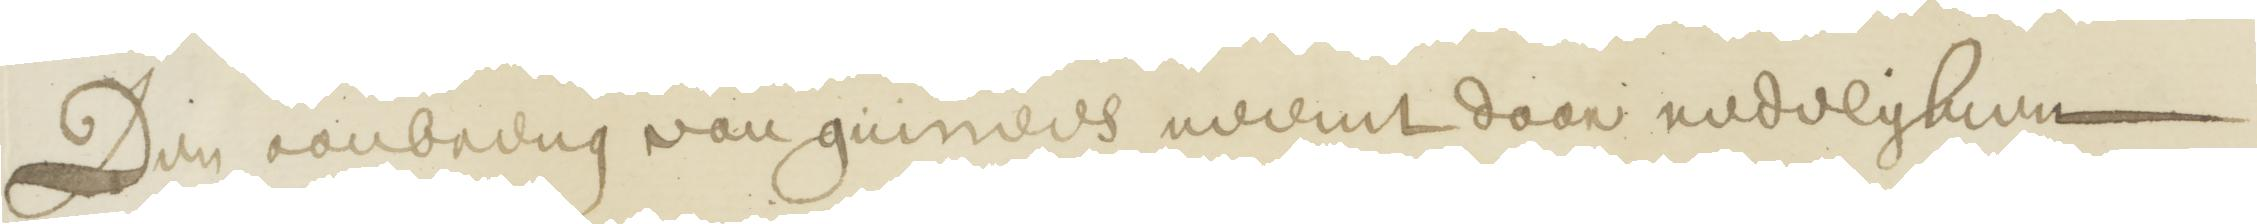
Den aanbreng van guinees neemt daar redelijken
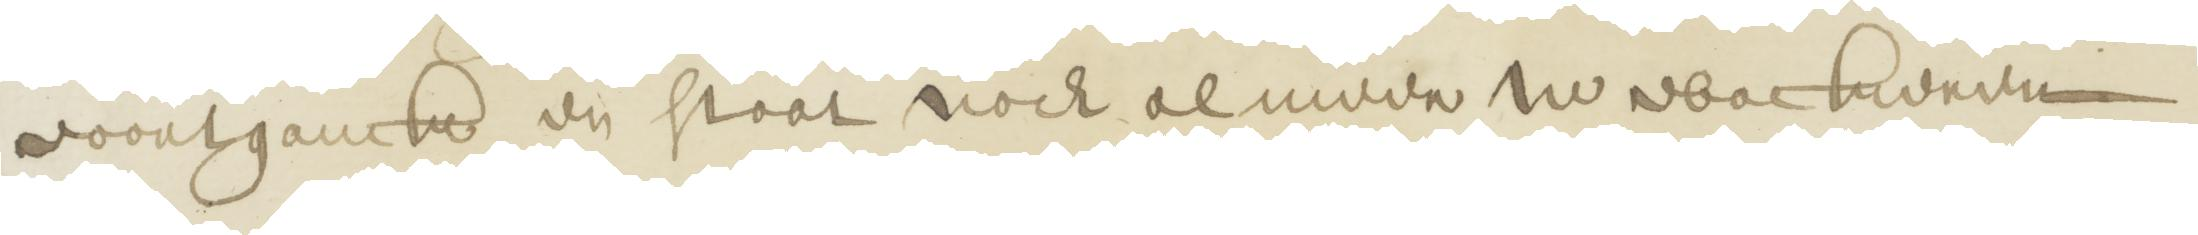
voortganck en staat noch al meer te wackeren
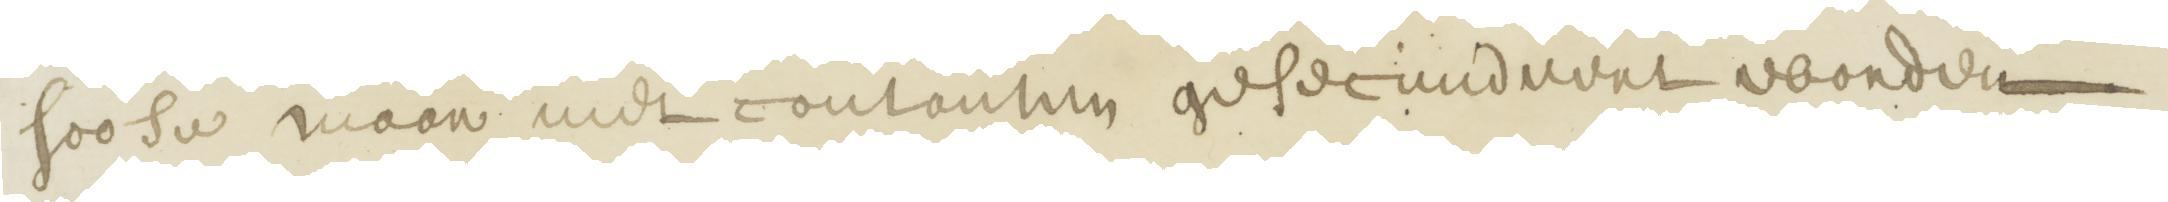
soo se maar met contanten gesecundeert worden
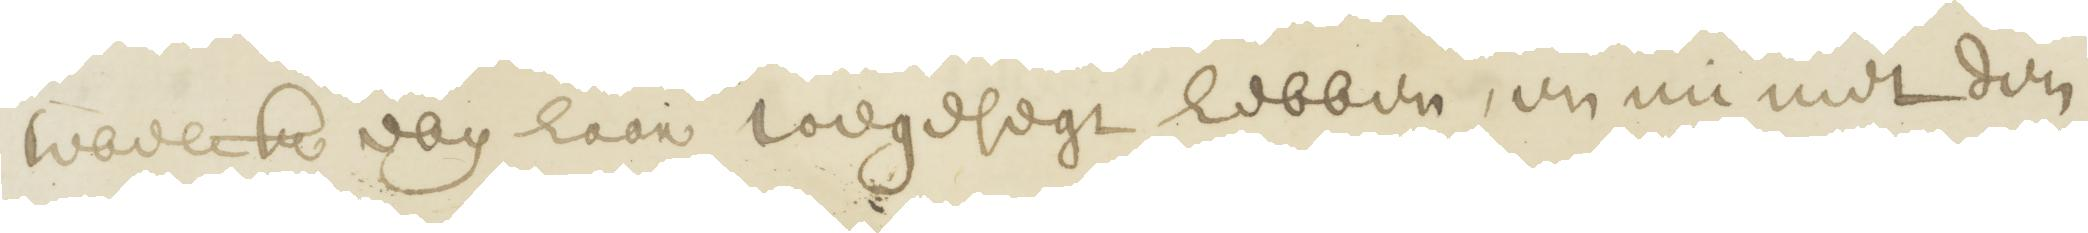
t welck wy haar toegesegt hebben, en nu met den
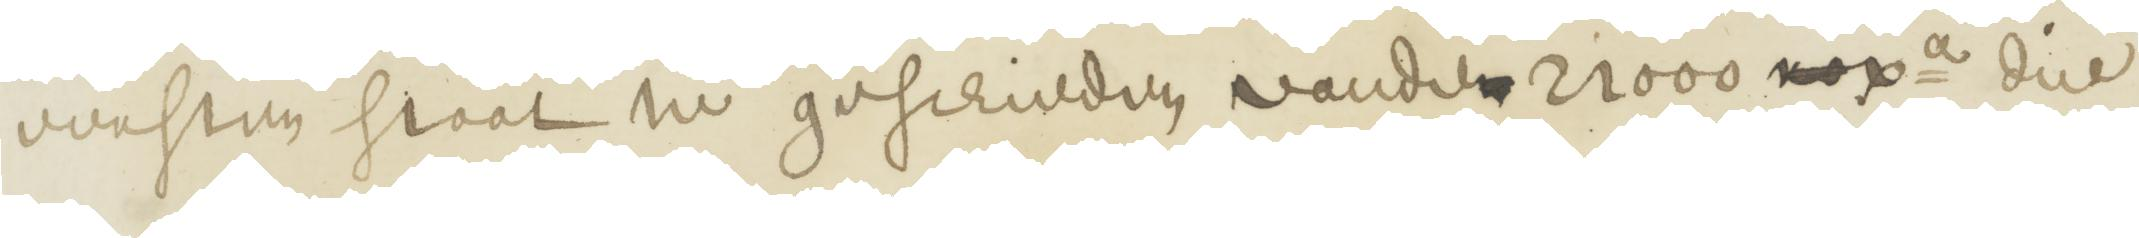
eersten staat te geschieden vanden 21000 rop=a die
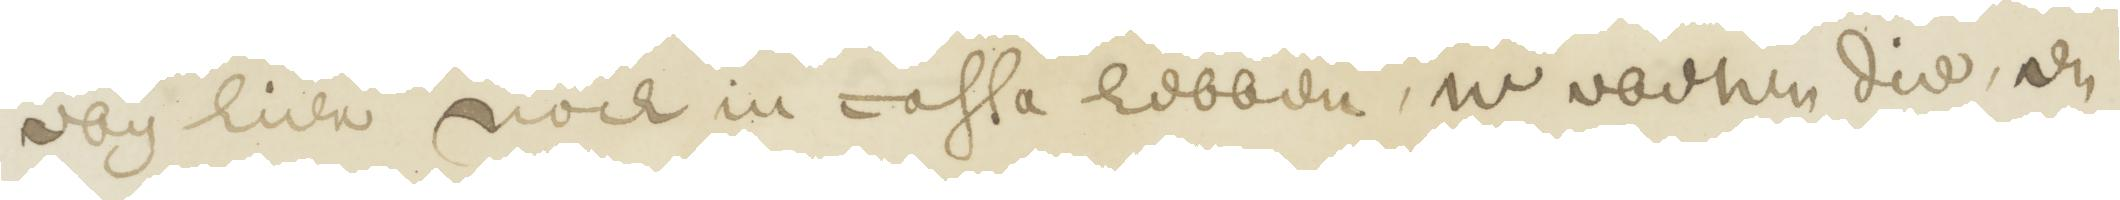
wy hier noch in cassa hebben, te weten die, en
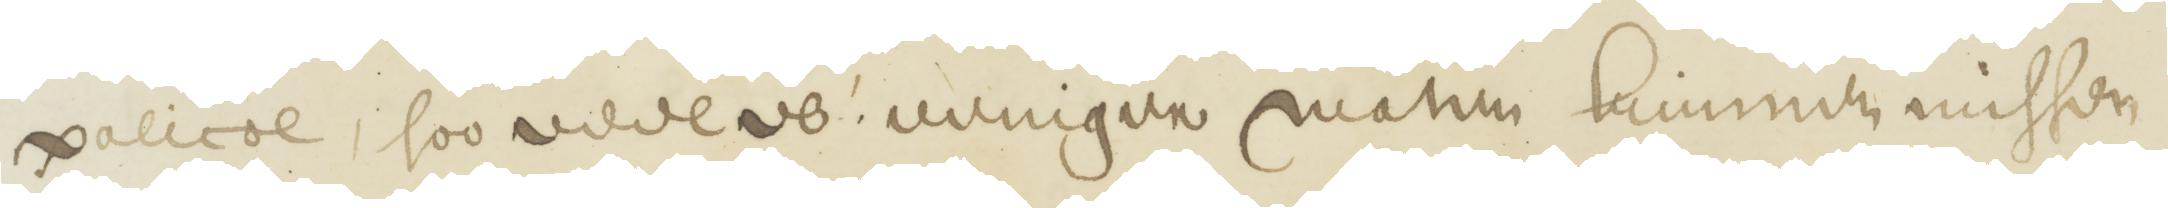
palicol, soo veel w: eeniger maten kunnen missen
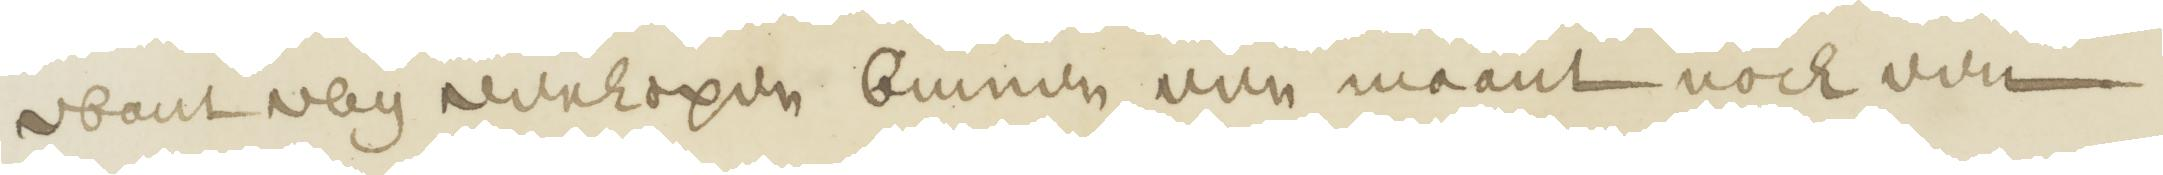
want wy verhopen binnen een maant noch een
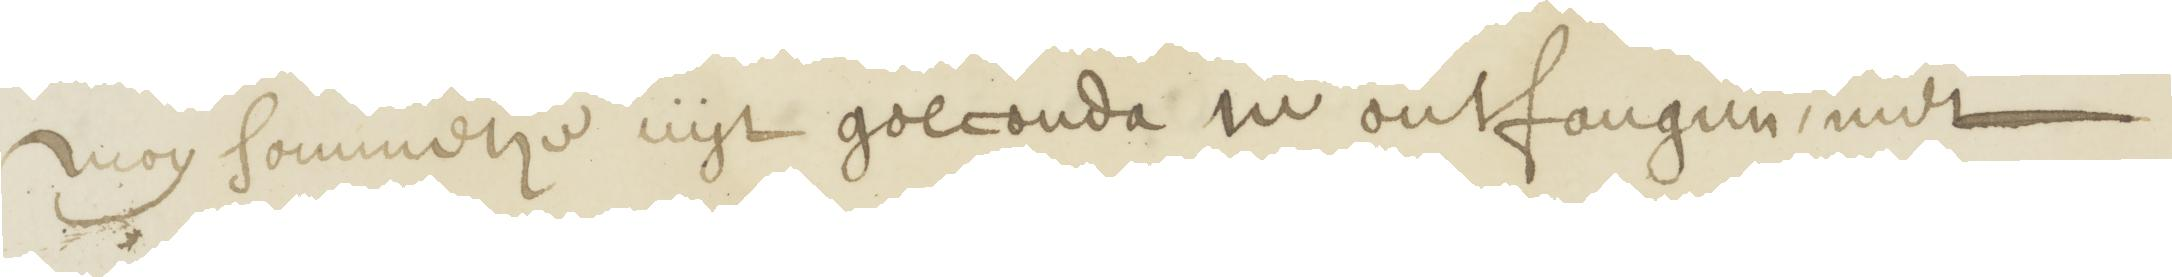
moy sommetje uijt golconda te ontfangen, met
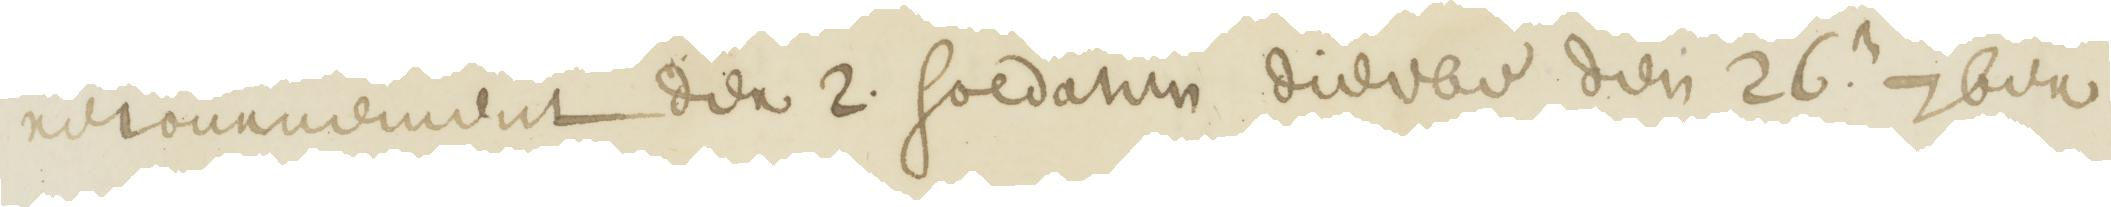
retournement der 2. soldaten diewe den 26.' 7ber
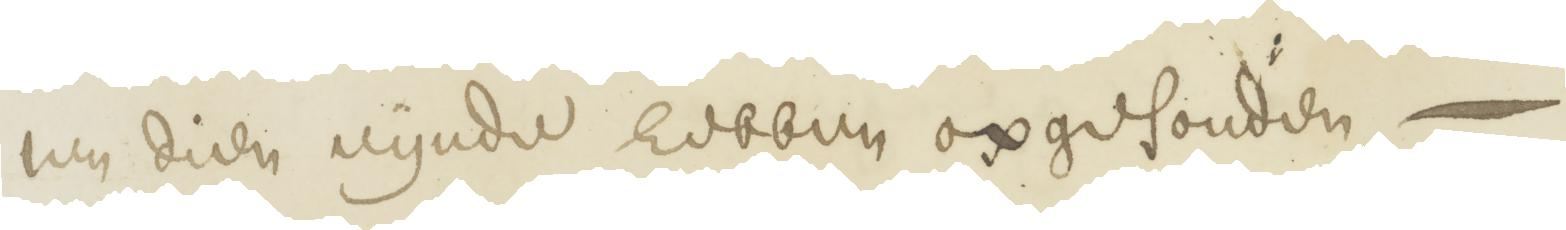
ten dien eijnde hebben op gesonden -
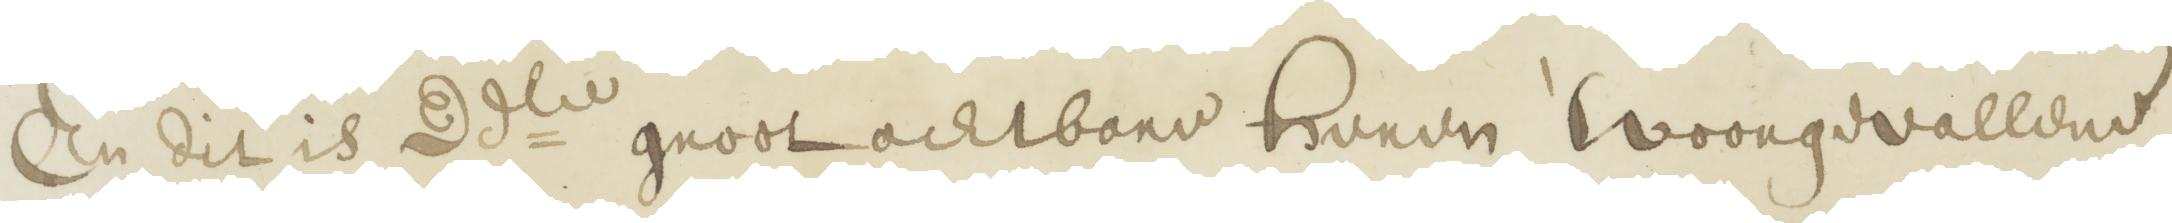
En dit is Ed=le groot achtbare heren ’t voorgevallene
